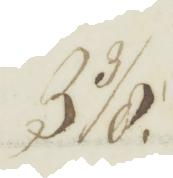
3 3/8.
